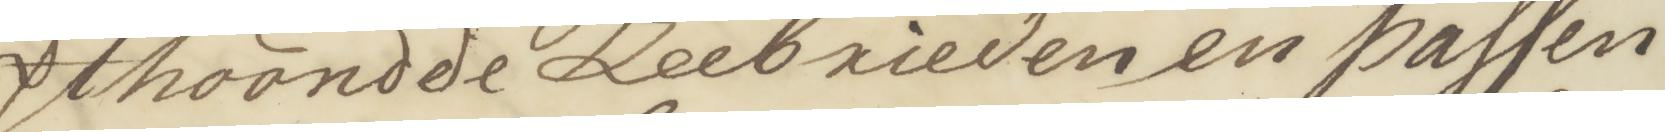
verthoondde zeebrieven en passen
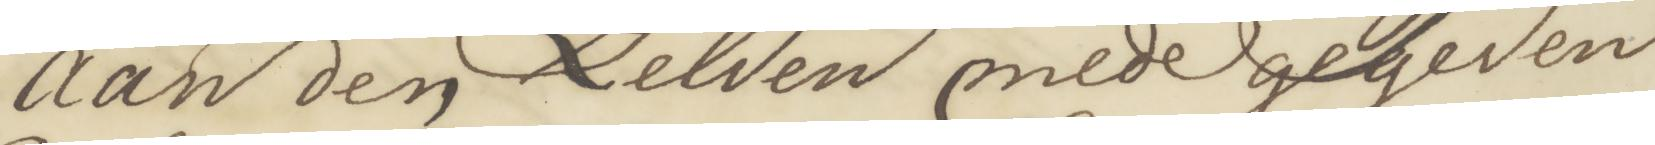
aan den zelven mede gegeven
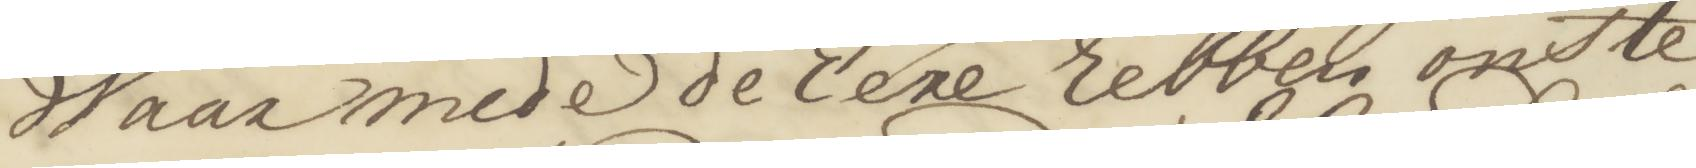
Waarmede de Eere hebben ons te
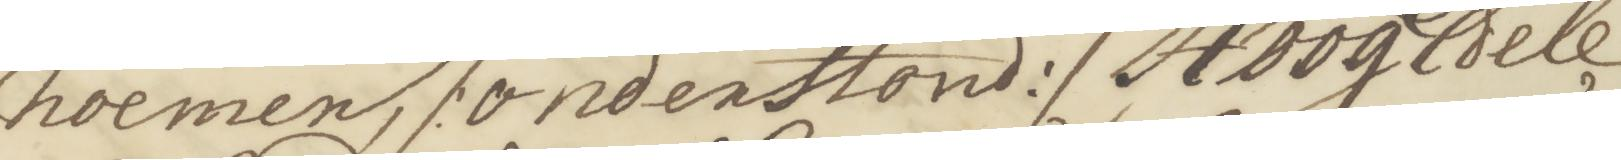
noemen, /: onderstond :/ Hoog Edele
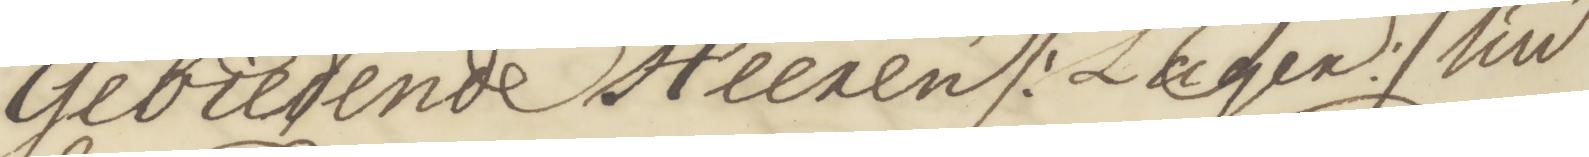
gebiedende Heeren /: Lagen :/ uw
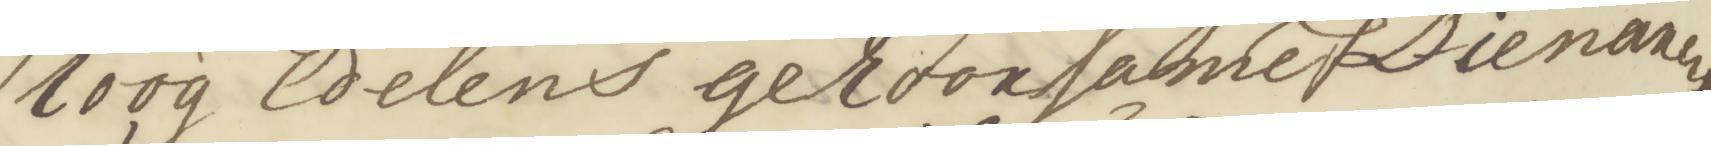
hoog Edelens gehoorsame Dienaren
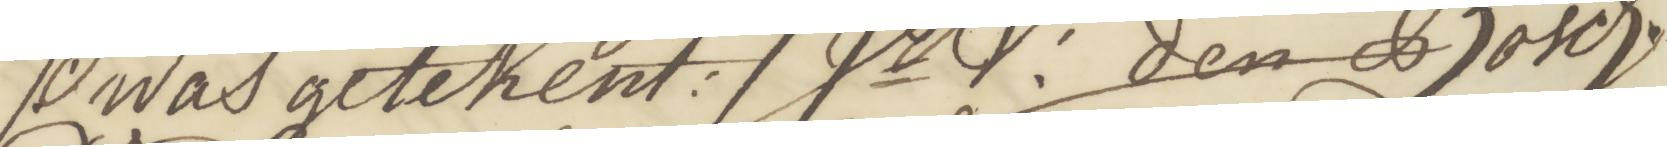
/: was getekent :/ J=b V: den Bosch.
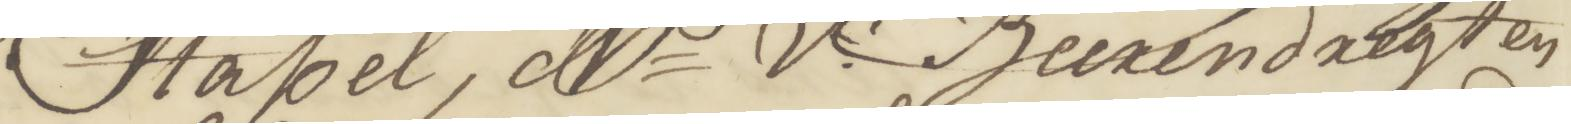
R. Stapel, N=en V: Beerendregt en
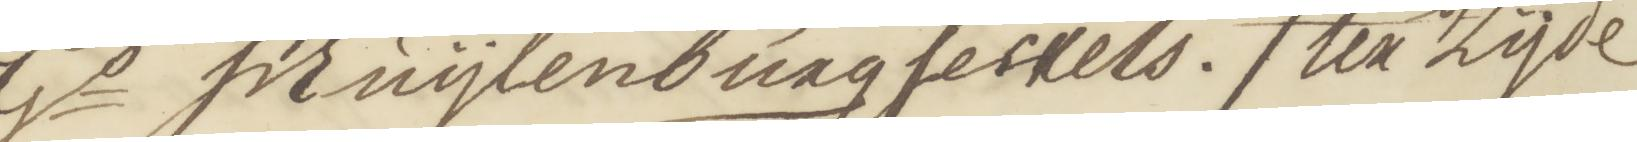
G=s schuijlenburg secrets. / ter zijde
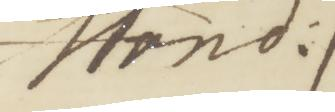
stond:/
